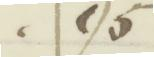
„ 95
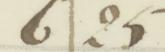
6 25
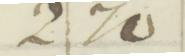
2 70
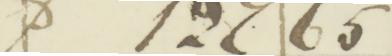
ƒ 127 65
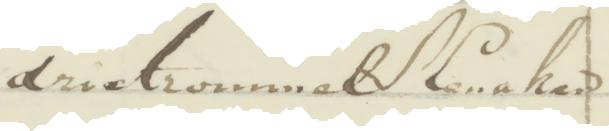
drie trommels Eenaker
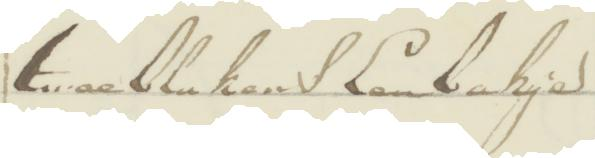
twee blakers Een bakje
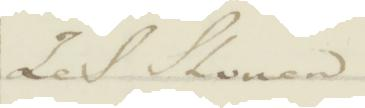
Zes stoven
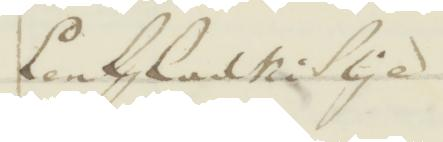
Een Gladkistje
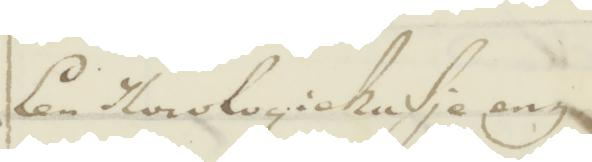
Een Horologie kasje enz
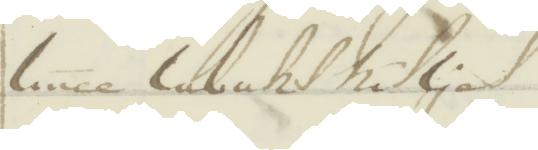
twee tabaks kistjes
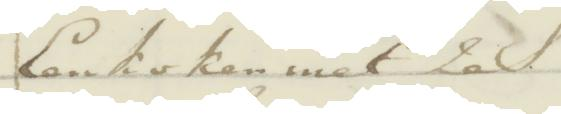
Een koker met zes
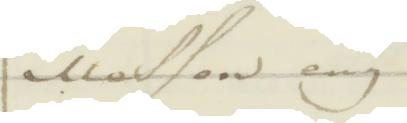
messen enz
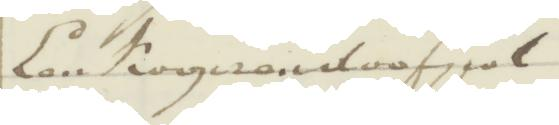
Een Kooperen doofpot
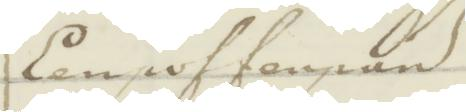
Een pofferpan
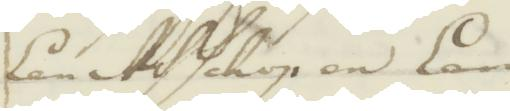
Een Asschop en Een
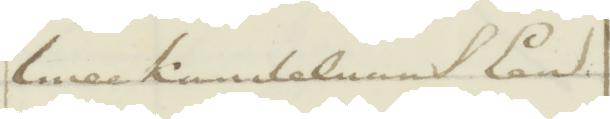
twee kandelaars Een
